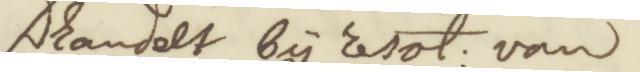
verhandelt bij resol: van
